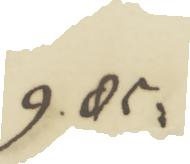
9.85:
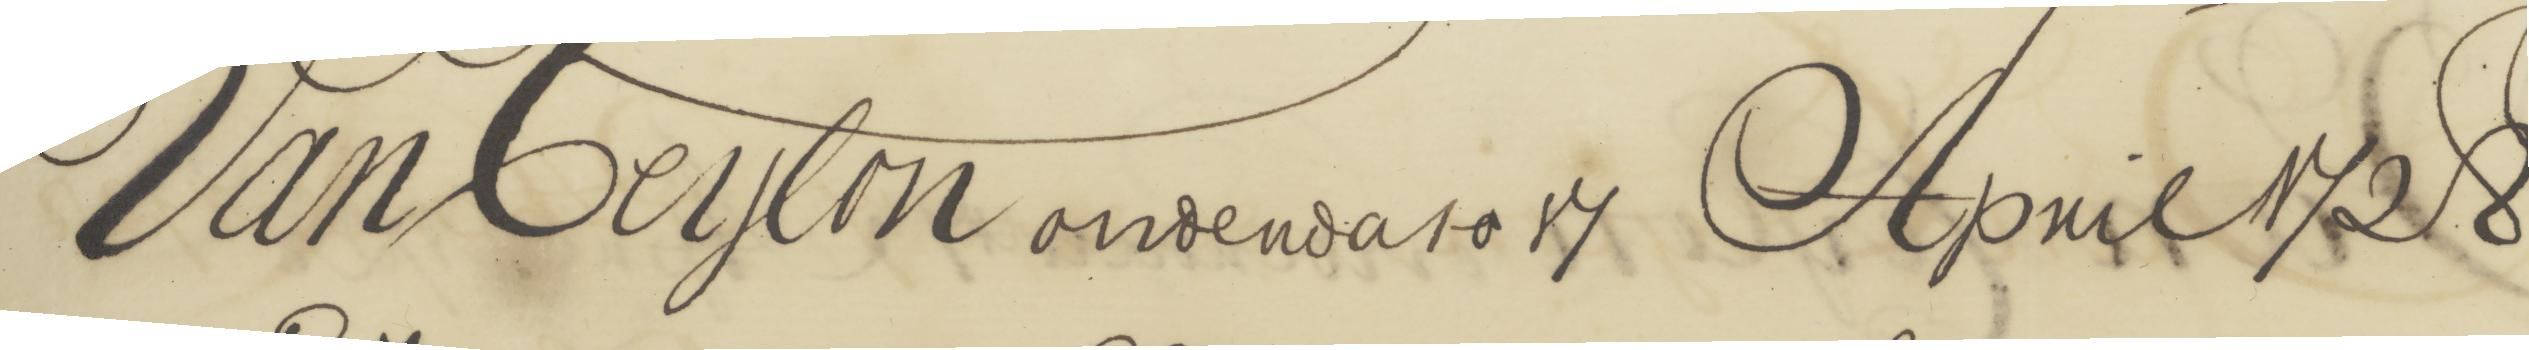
Van Ceylon onderdato 17 April 1728
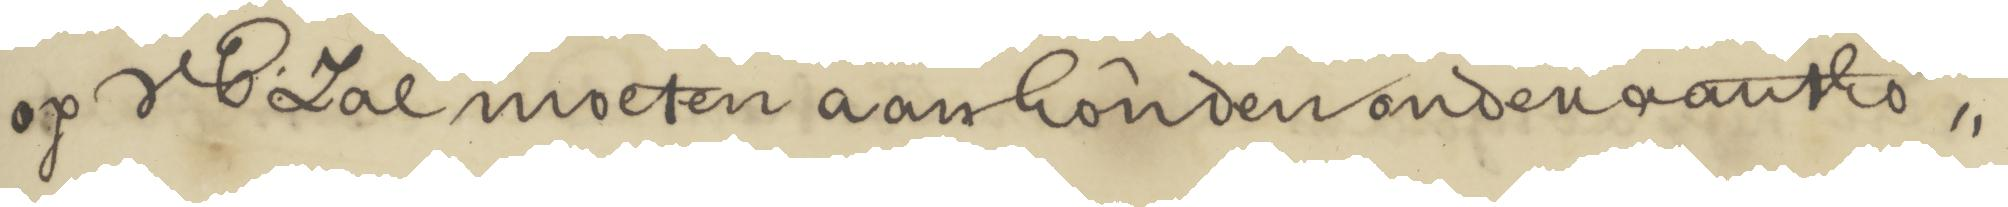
op VE: zal moeten aanhouden onder aantho„
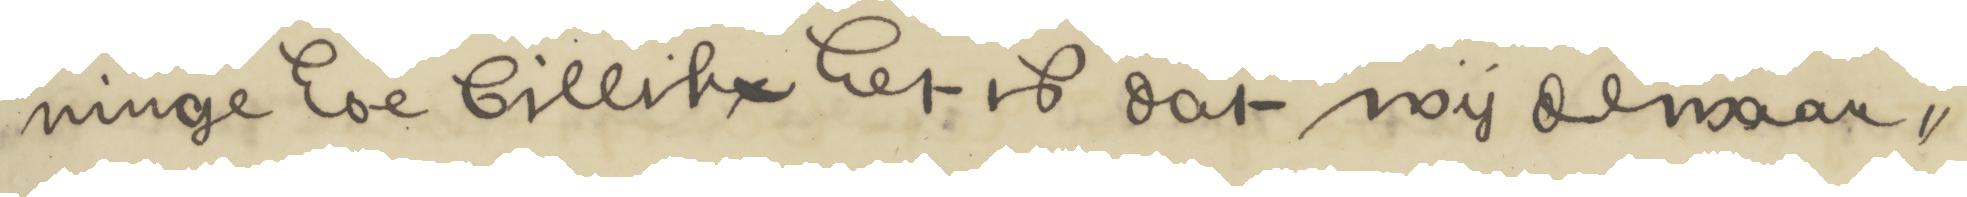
ninge hoe billik het is dat wij de waar„
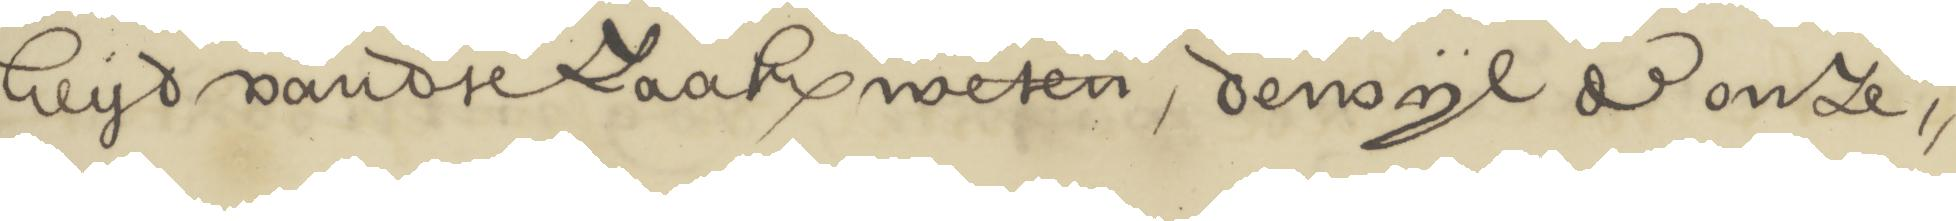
heijd van die zaak weten, dewijl de onze„
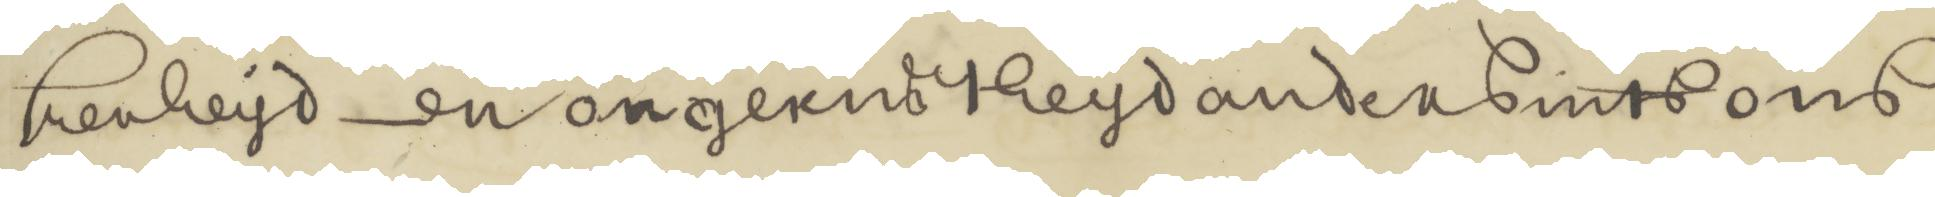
kerheijd en ongerustheijd andersints ons
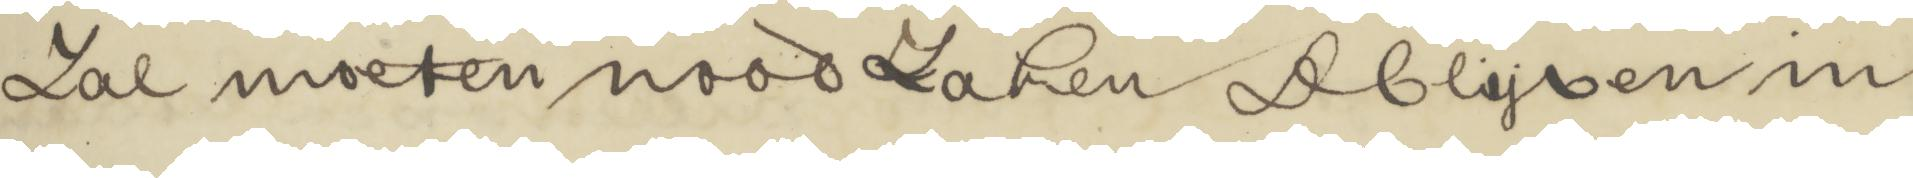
zal moeten noodzaken te blijven in
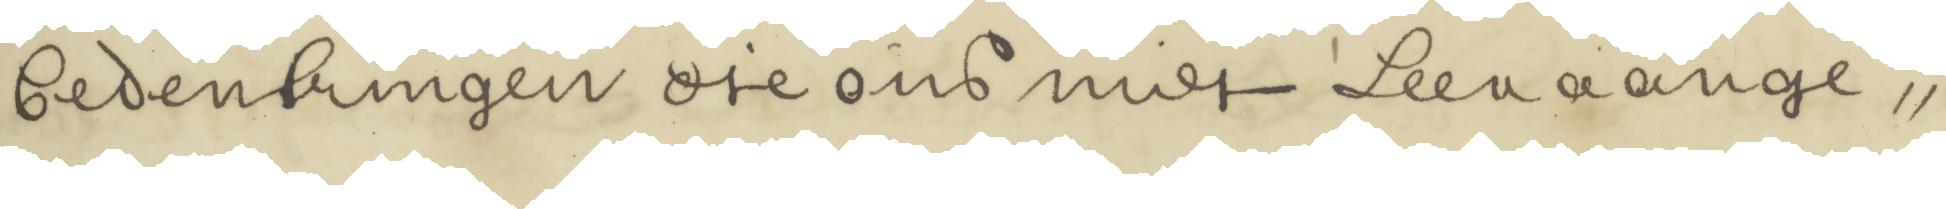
bedenkingen die ons niet seer aange„
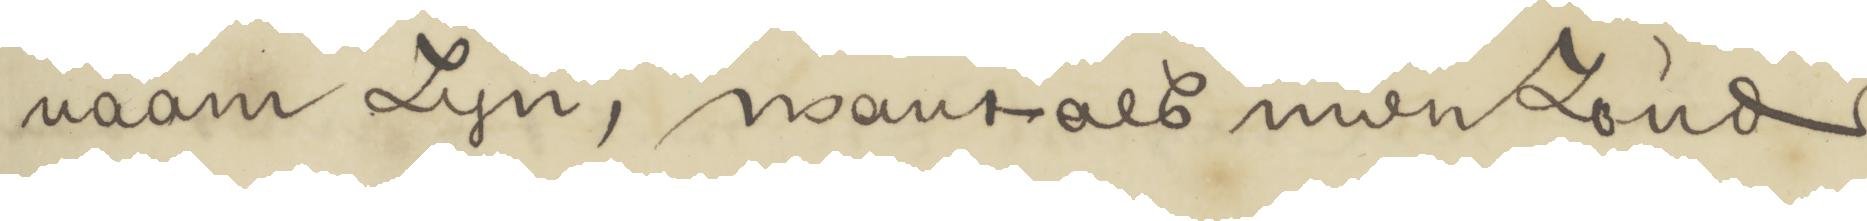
naam zijn, want als men zoude
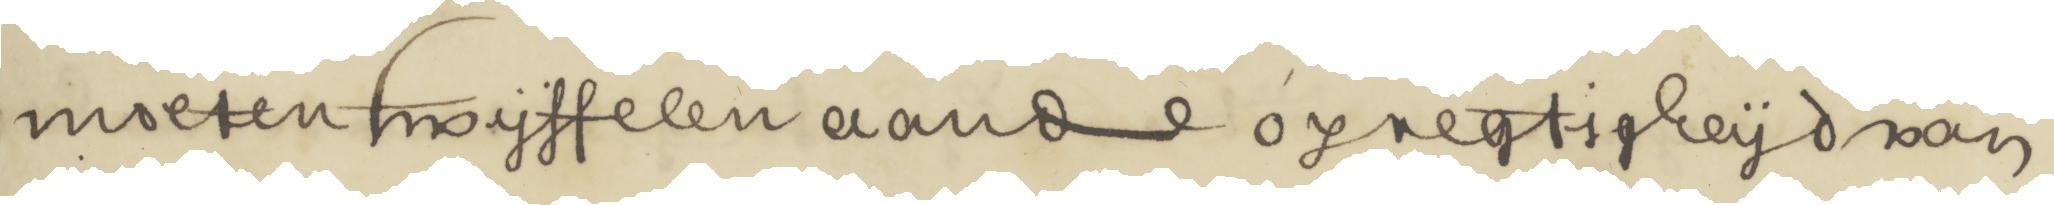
moeten twijffelen aan de opregtigheijd van
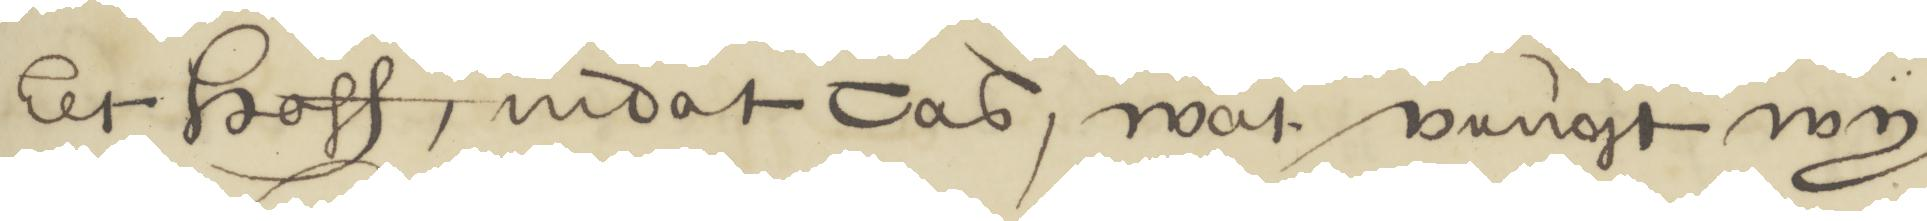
het hoff, indat cas, wat vrugt wij
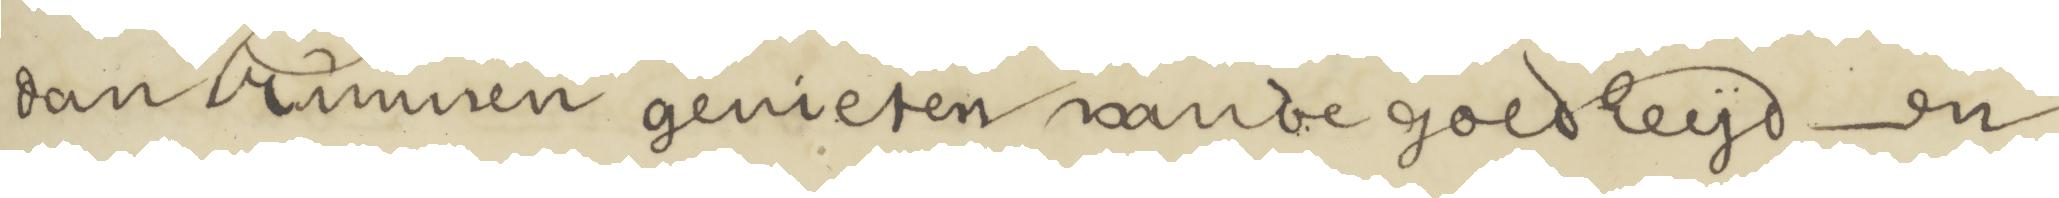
dan kunnen genieten vande goedheijd en
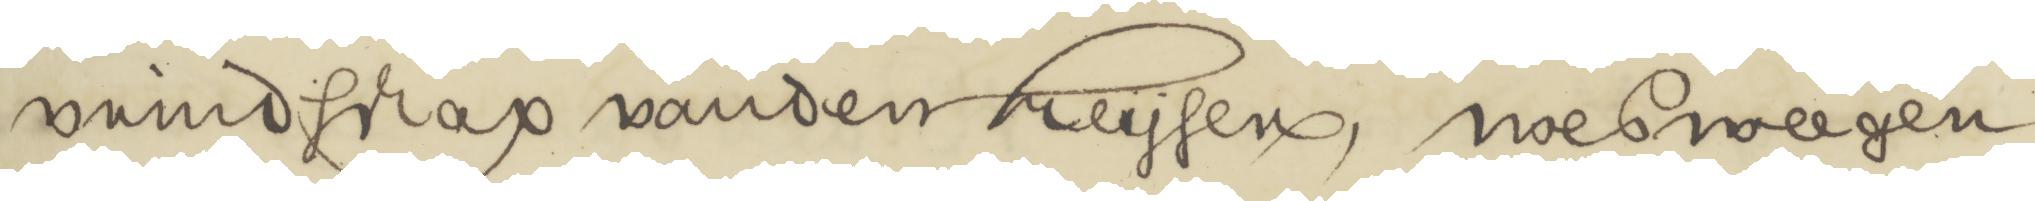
vrindschap van den keijser, wesweegen
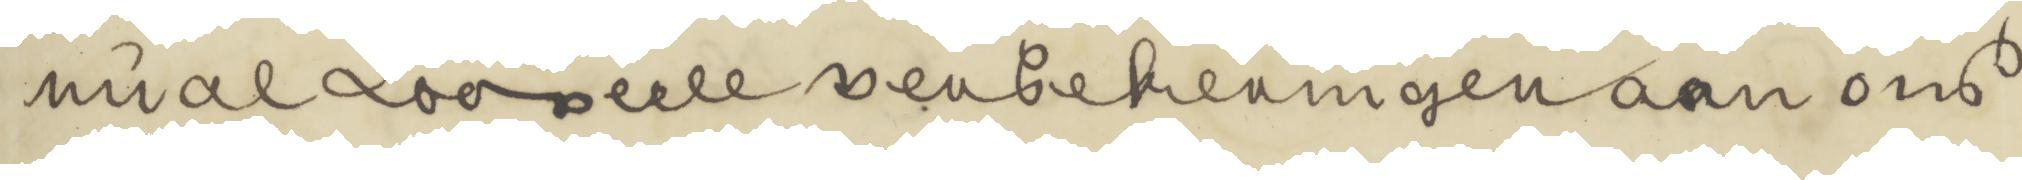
nu al zooveele verbekeringen aan ons
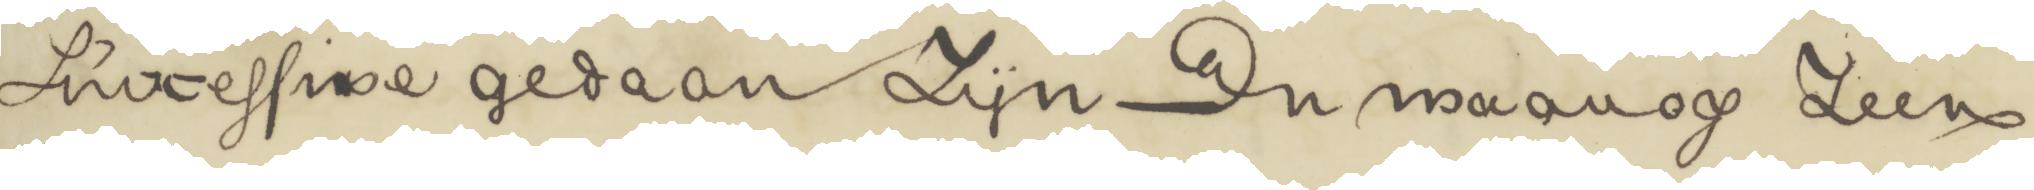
successive gedaan zijn En waarop men zeer
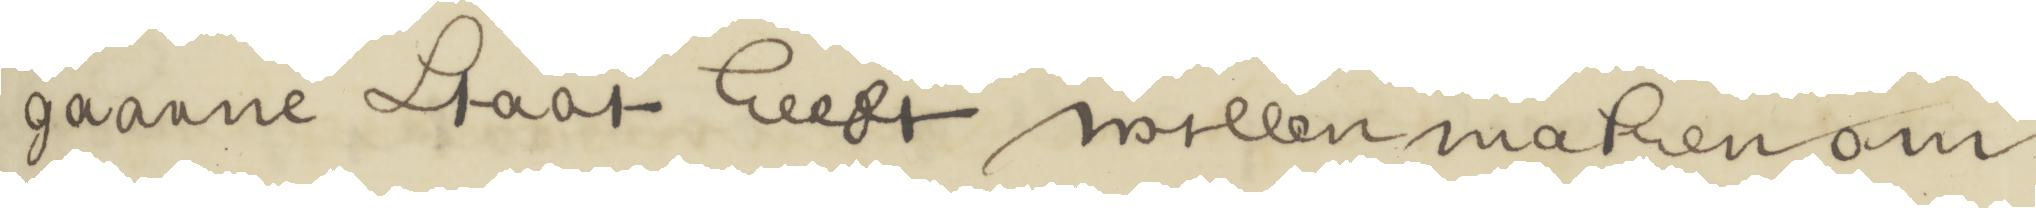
gaarne staat heeft willen maken om
